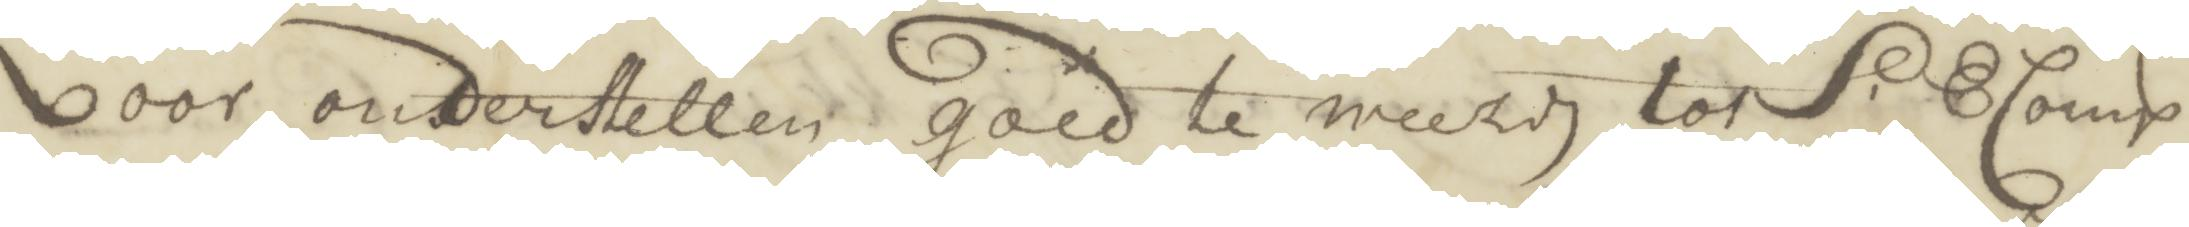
voor onderstellen goed te weezen tot S' E Comp
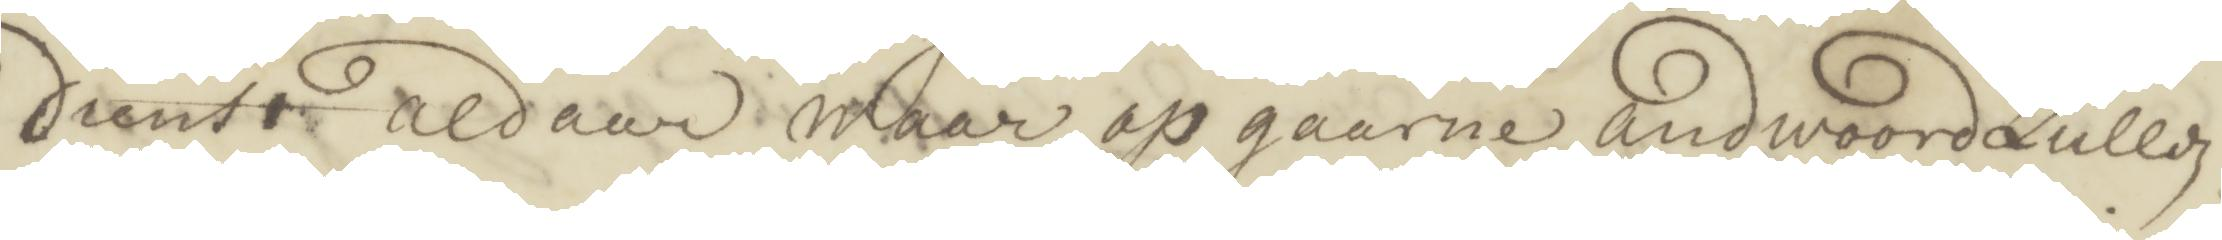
dienst aldaar waar op gaarne andwoord zullen
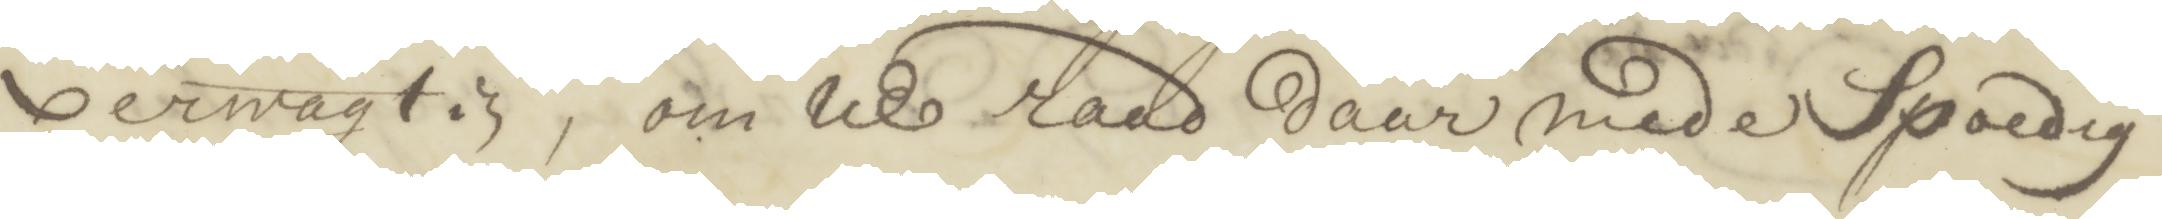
verwagten, om uE raad daar mede Spoedig
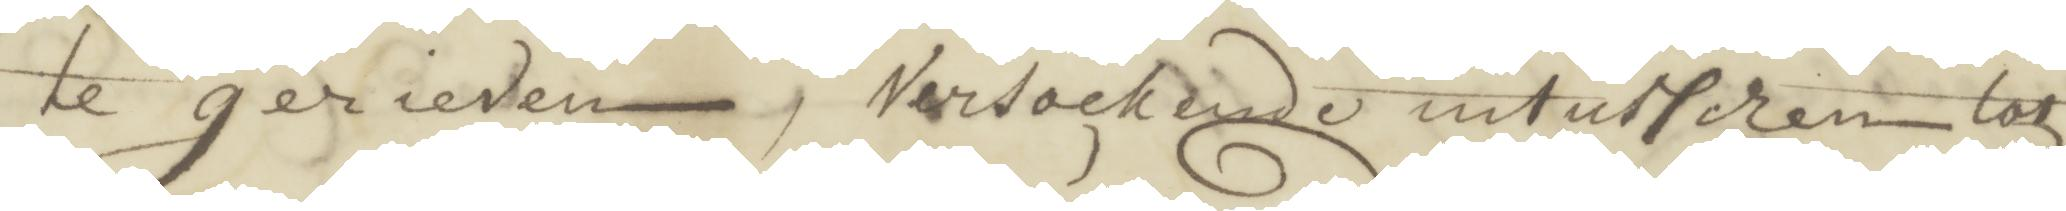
te gerieven, versoekende intusschen tot
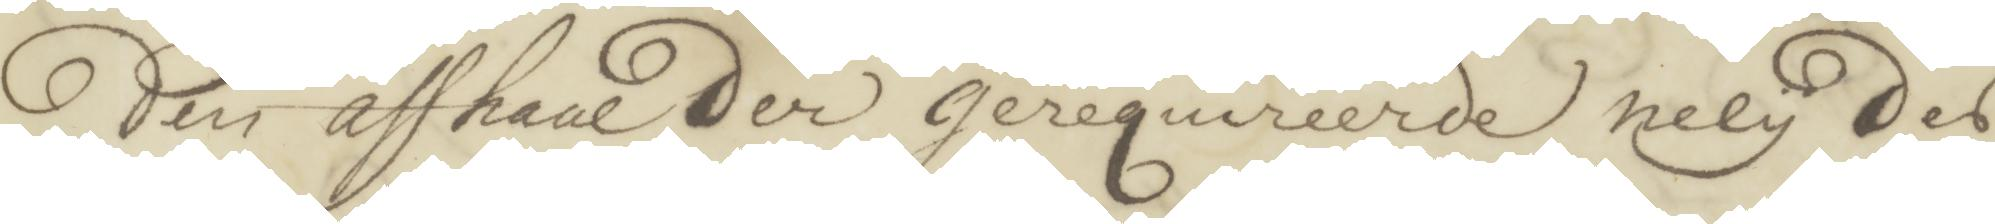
den affhaal der gerequireerde nelij des
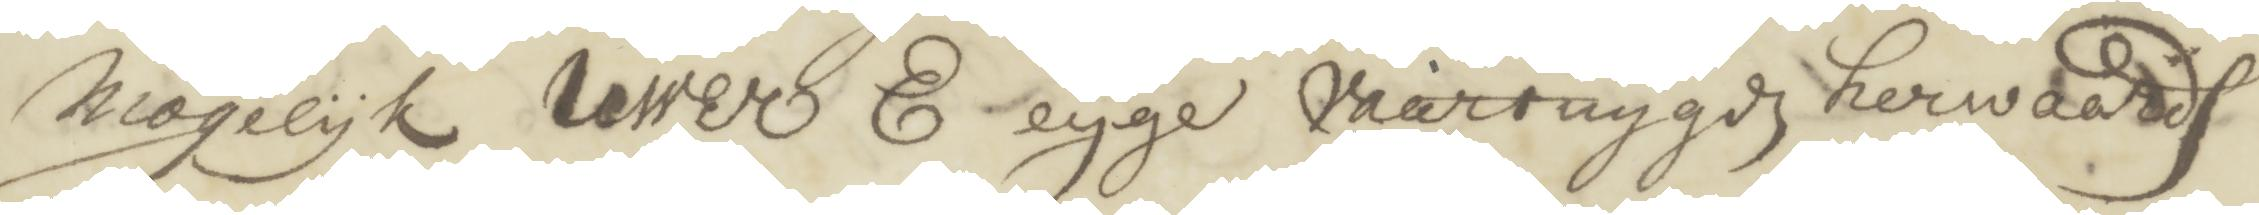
mogelijk uwer E eijge vaartuygen herwaards
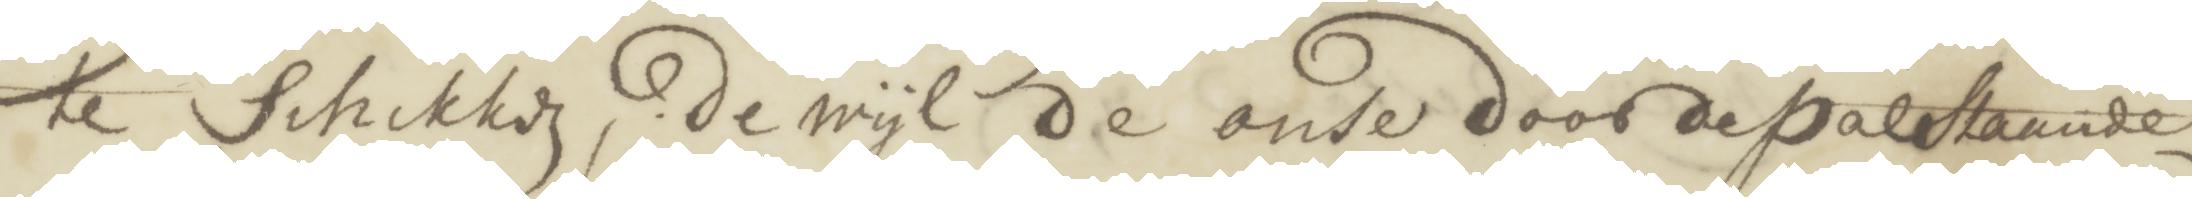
te schikken, de wijl de onse door de palstaande
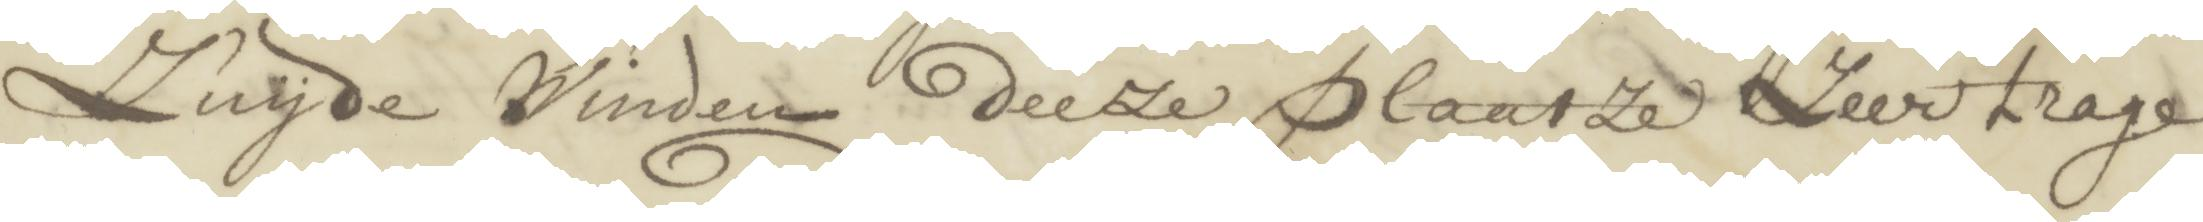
Zuijde vinden deeze plaatze zeer trage
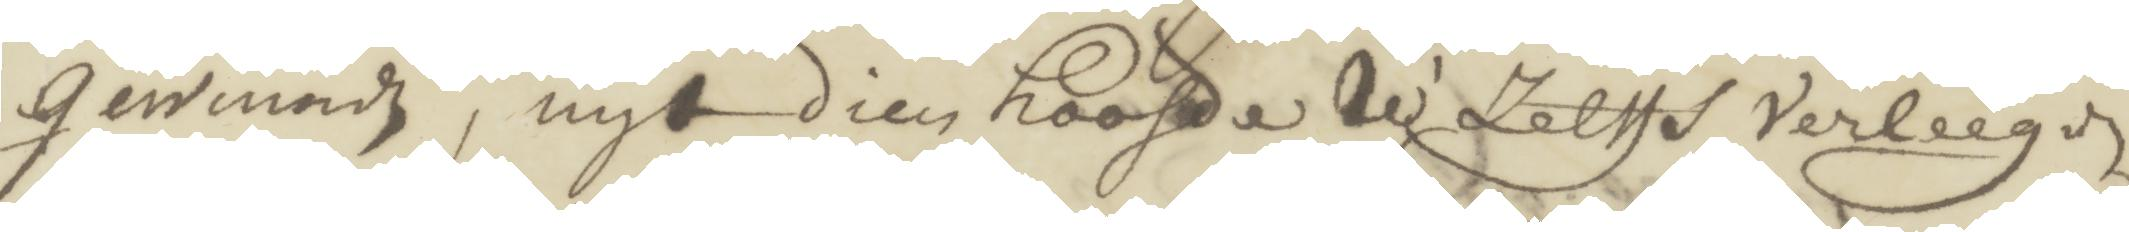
gewinnen, uyt dien hoofde te zelffs verleegen
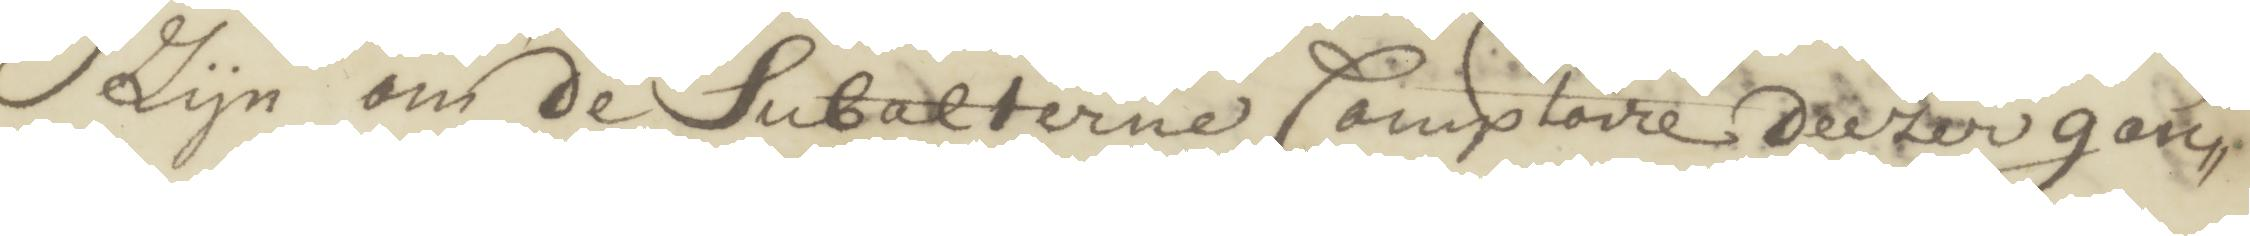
zijn om de subalterne Comptoire deezen gou„
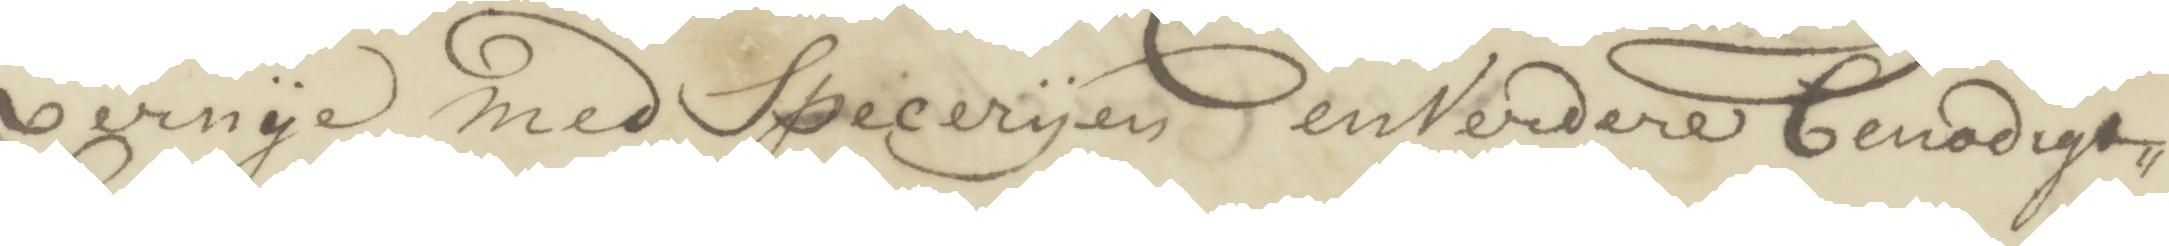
vernije med Specerijen en verdere benodigt,
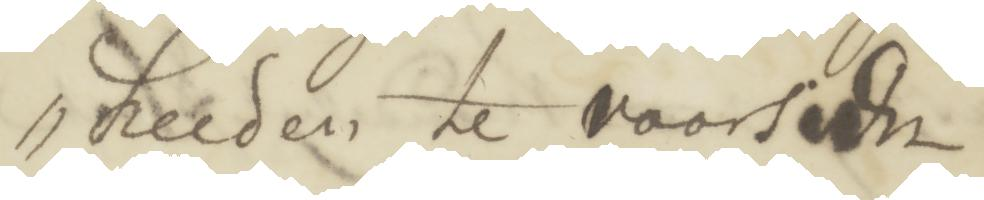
„heeden te voorsien
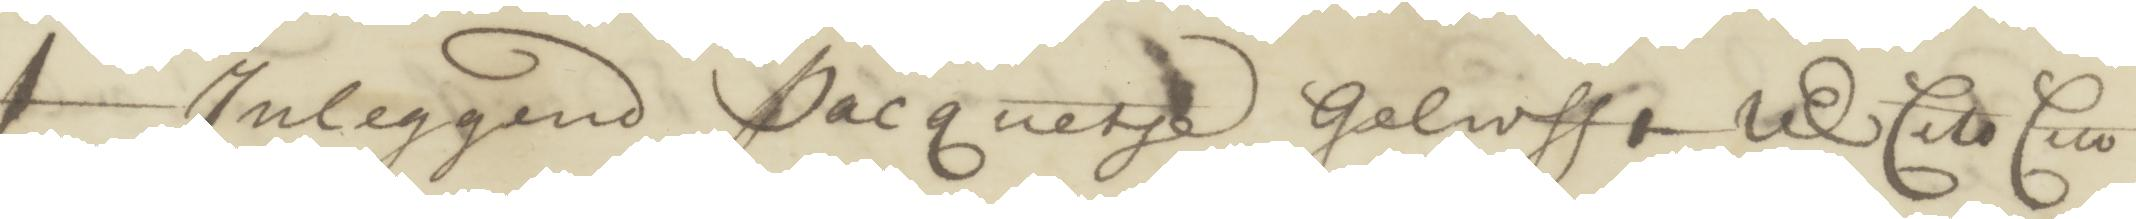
t Jnleggend pacquetje geliefft uE cito cito
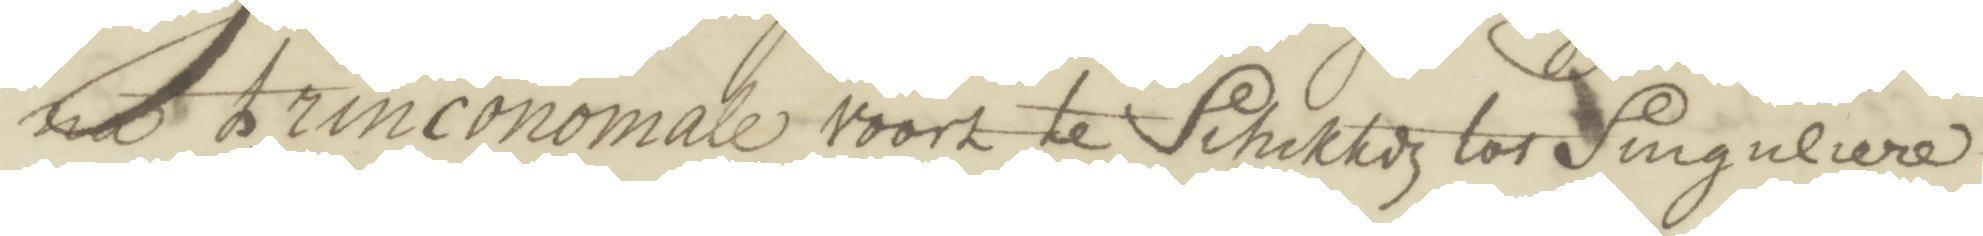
na trinconomale voort te Schikken tot Singuliere
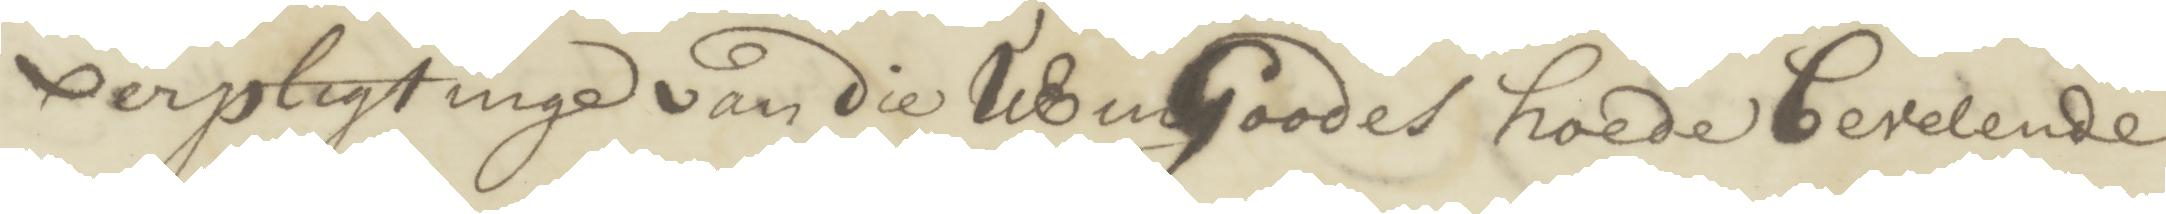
verpligtinge van die UE in Goodes hoede bevelende
